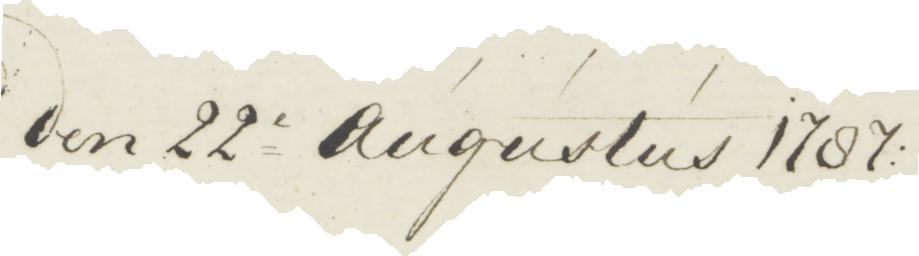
den 22=e augustus 1787:
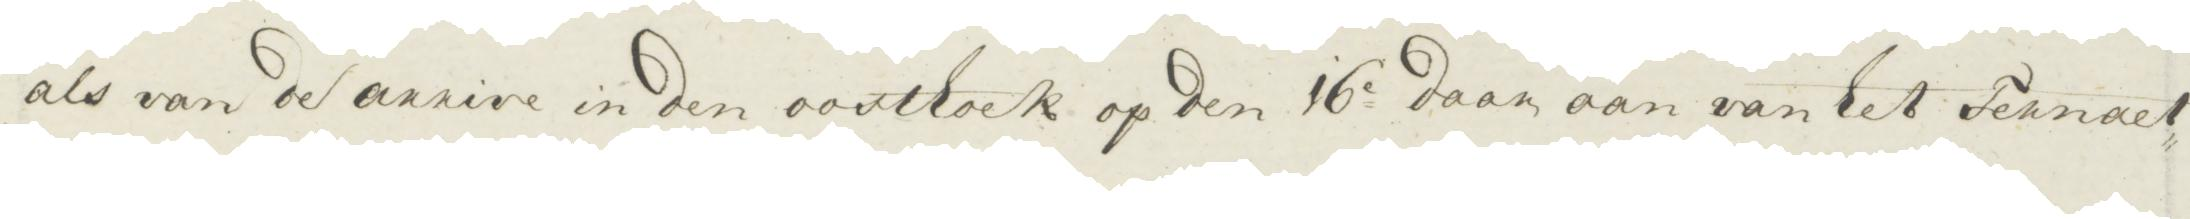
als van de arrive in den oosthoek op den 16=e daar aan van het Ternaet„
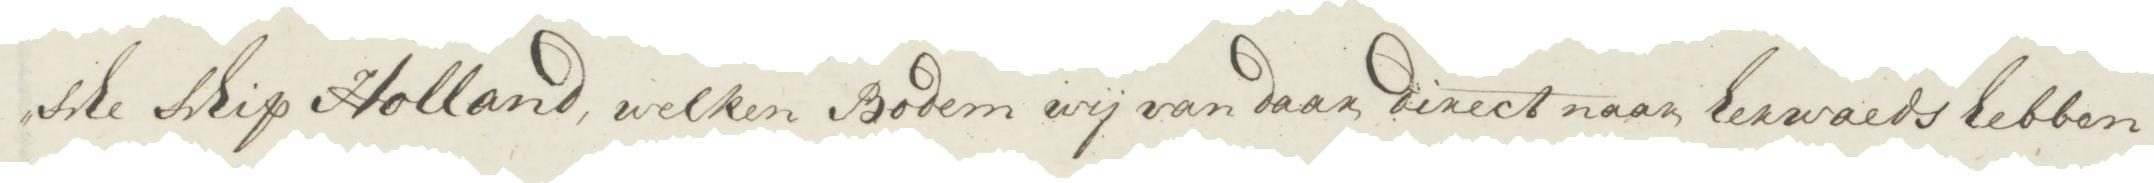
„sche schip Holland, welken Bodem wij van daar direct naar herwaeds hebben
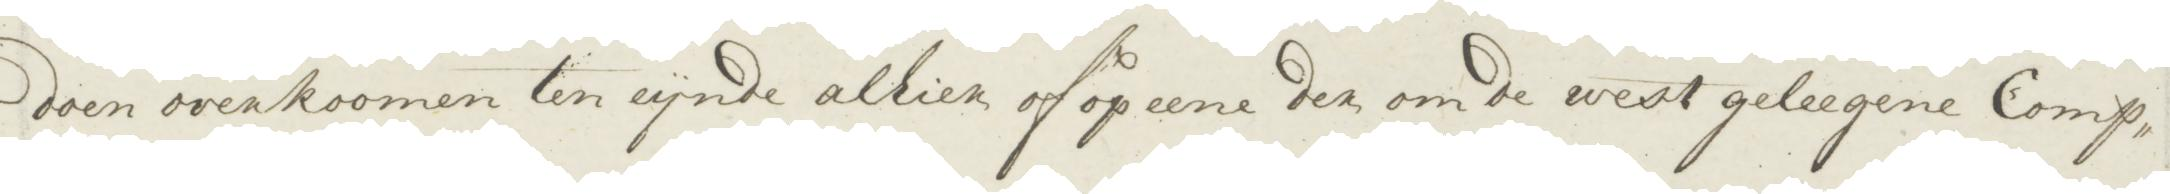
doen overkoomen ten eijnde alhier of op eene der om de west geleegene Comp„
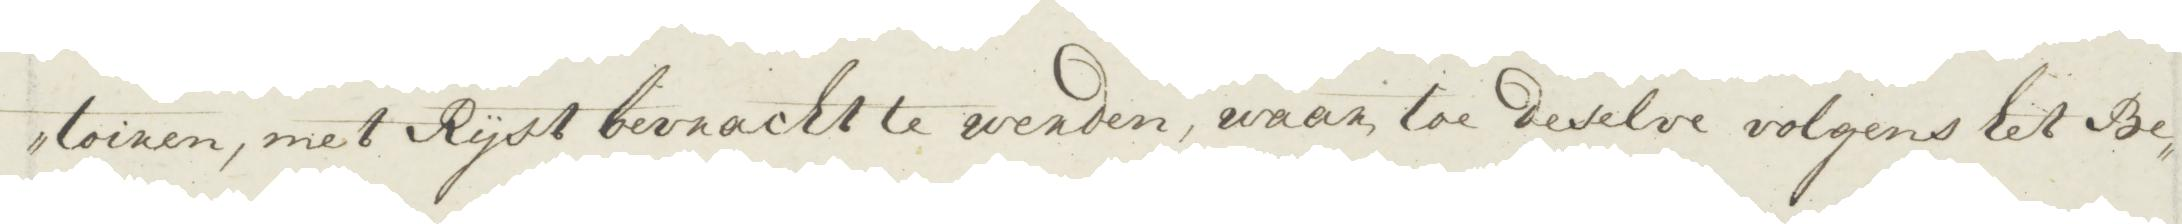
„toiren, met Rijst bevracht te werden, waar toe deselve volgens het Be„
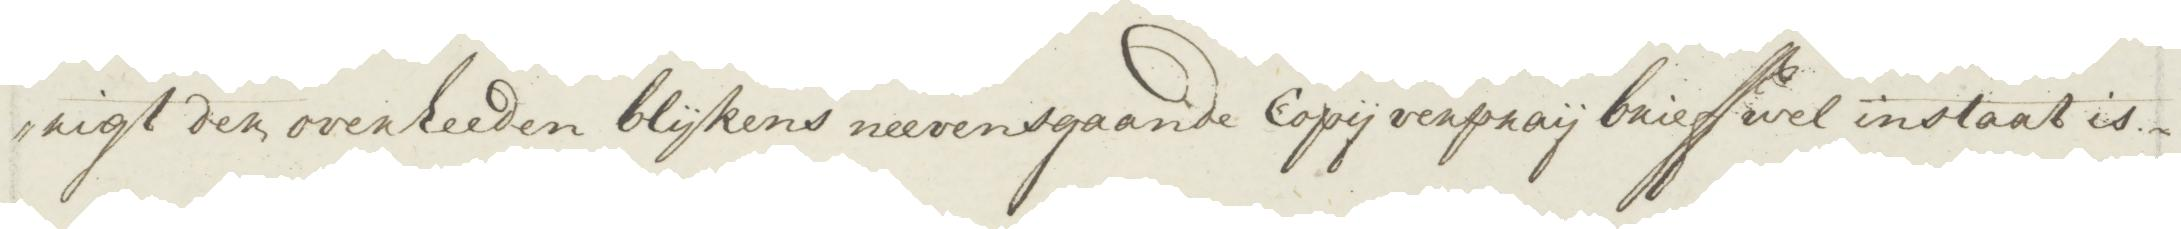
„rigt den overheeden blijkens neevensgaande Copij verpraij brieff wel instaat is. —
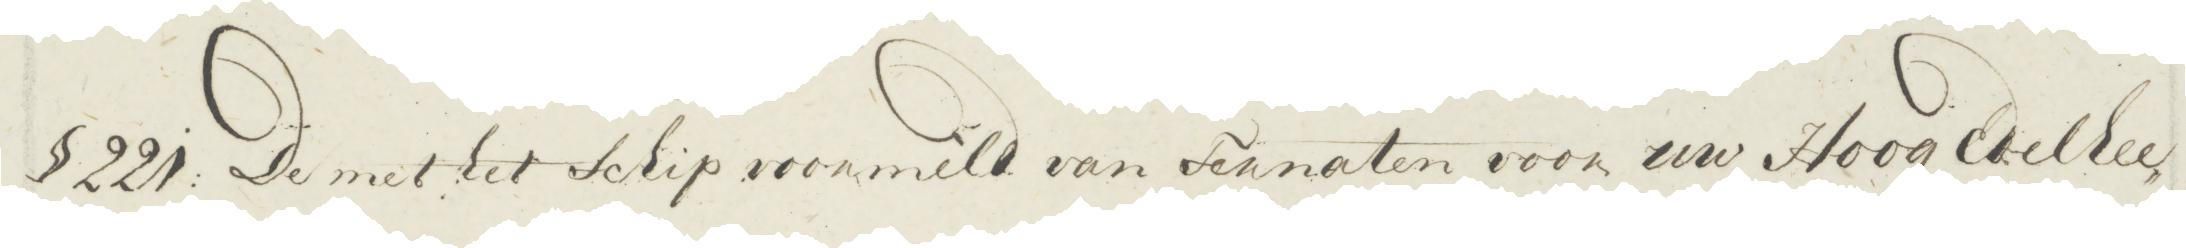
§ 221: De met het schip voormeld van Ternaten voor uw Hoog Edelhee„
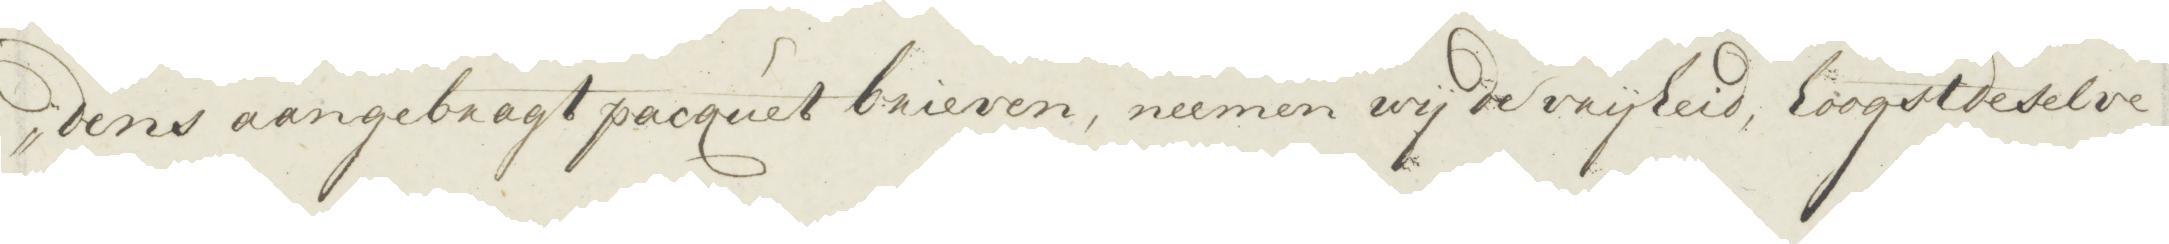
„dens aangebragt pacquet brieven, neemen wij de vrijheid, hoogstdeselve
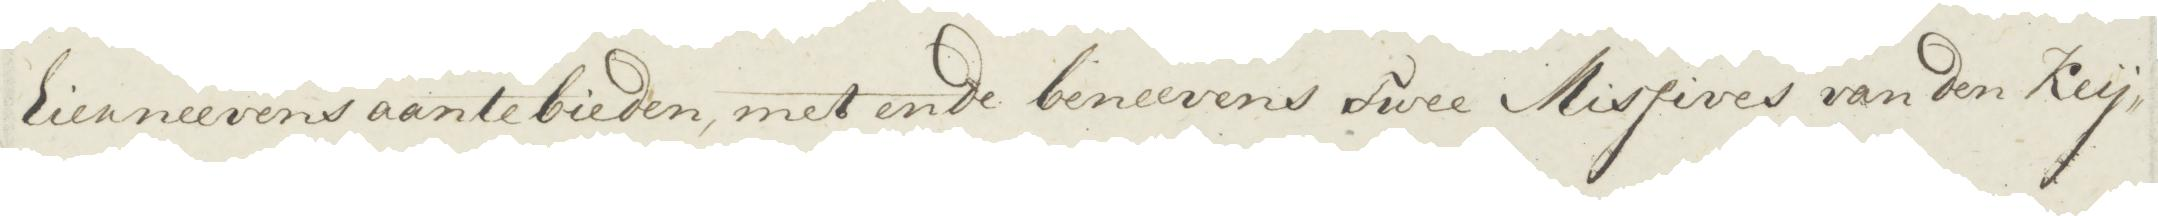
hierneevens aan te bieden, met ende beneevens Twee Missives van den keij„
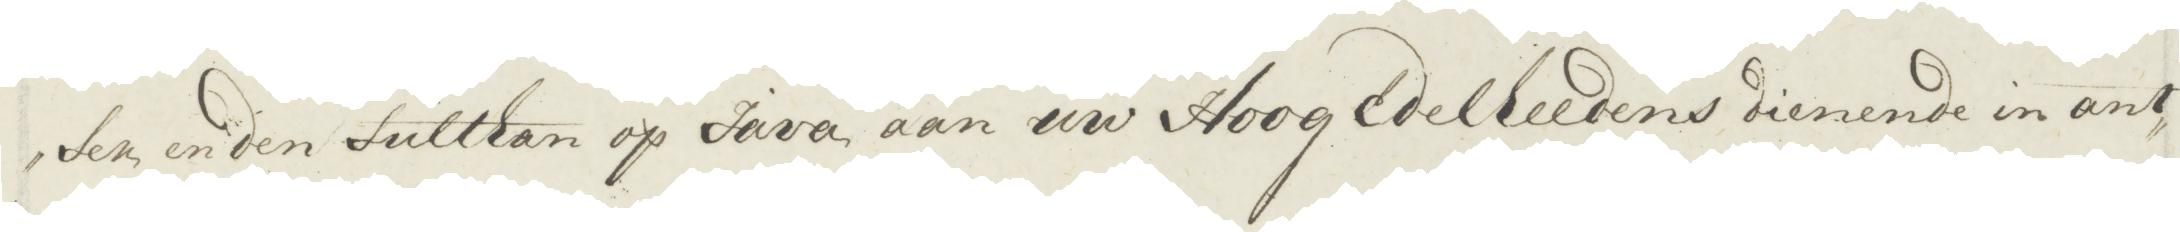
„ser en den sulthan op Java aan uw Hoog Edelheedens dienende in ant„
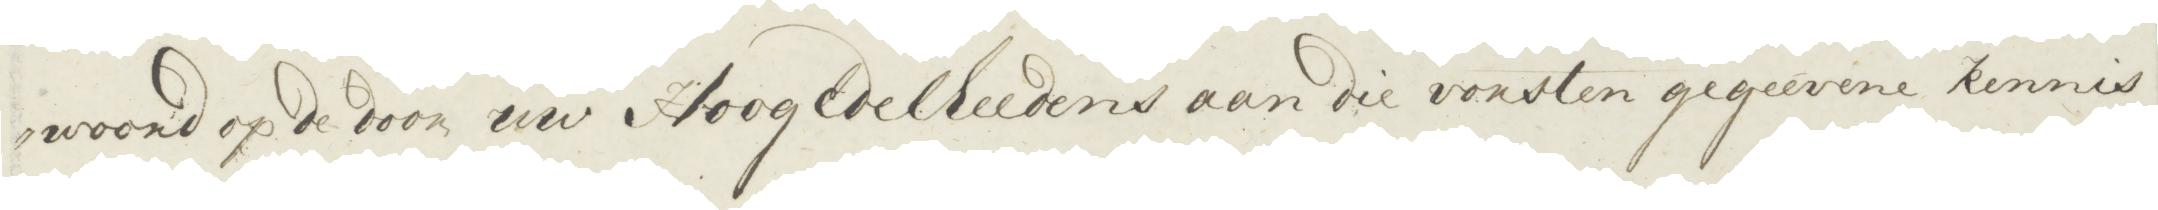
„woord op de door uw Hoog Edelheedens aan die vorsten gegeevene kennis
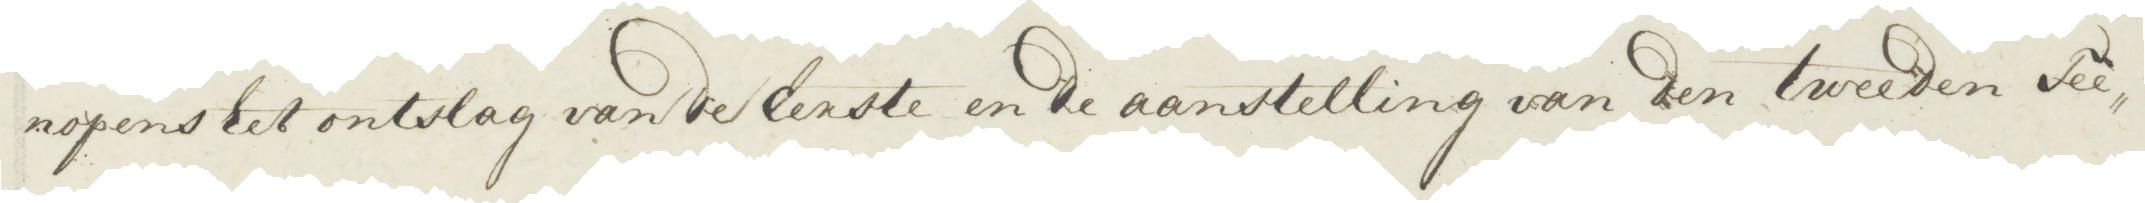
nopens het ontslag van de Eerste en de aanstelling van den tweeden Tee„
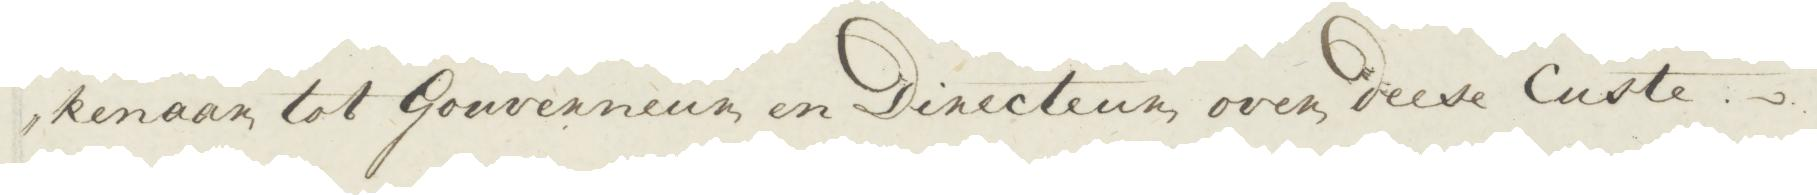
„kenaar tot Gouverneur en Directeur over deese custe. —
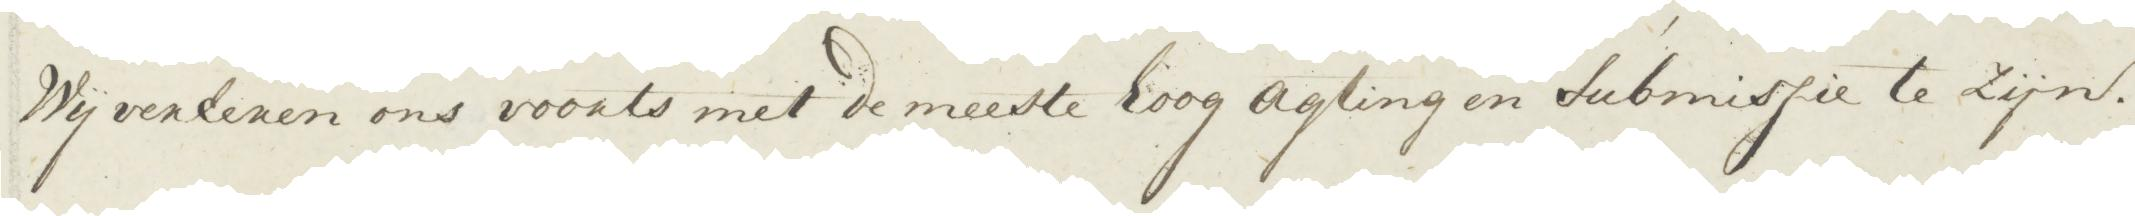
Wij verEeren ons voorts met de meeste hoog agting en submissie te zijn.
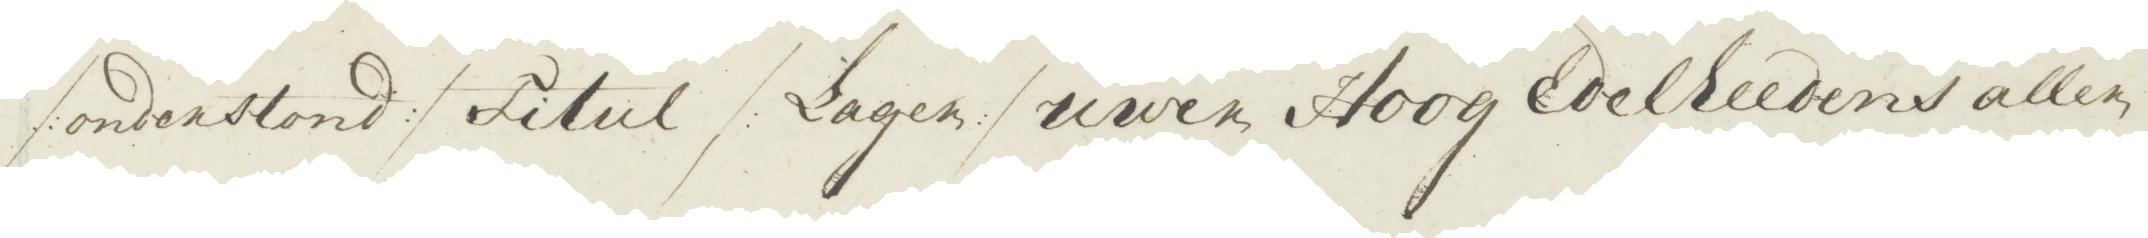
/:onderstond:/ Titul /:Lager:/ uwer Hoog Edelheedens aller
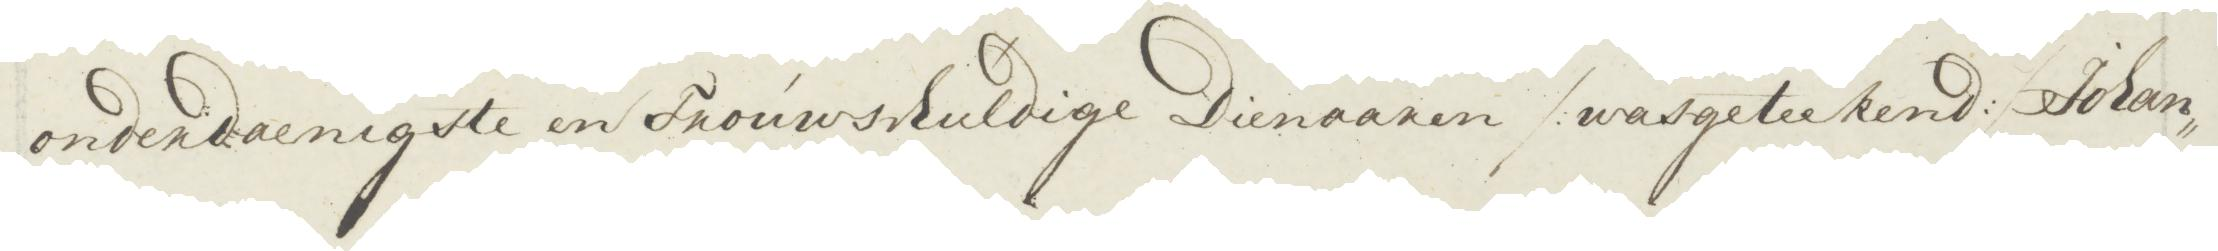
onderdaenigste en Trouwschuldige Dienaaren /:was geteekend:/ Iohan„
